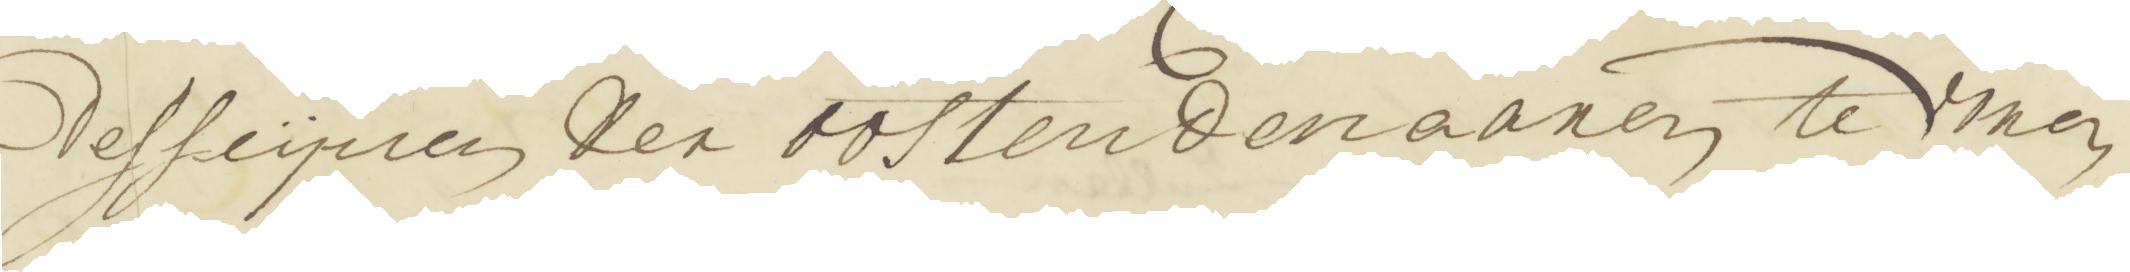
desseijnen der oosten den aaren te voren
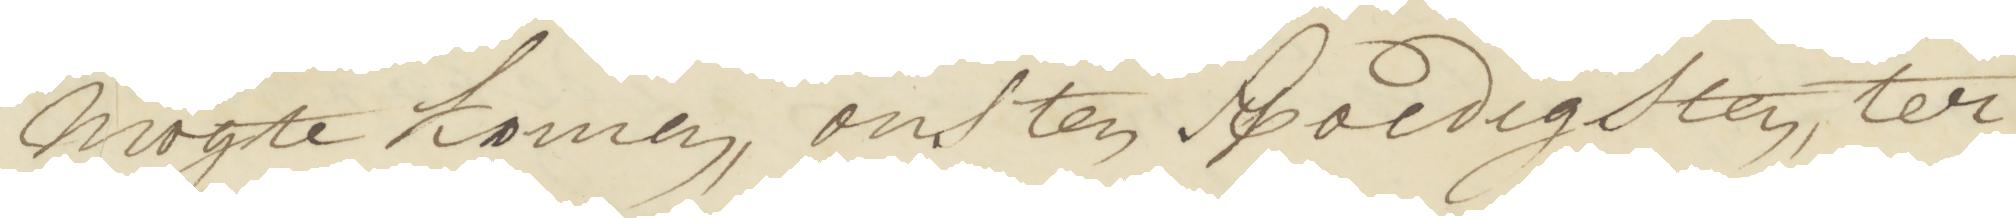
mogte komen, ons ten spoedigsten, ter
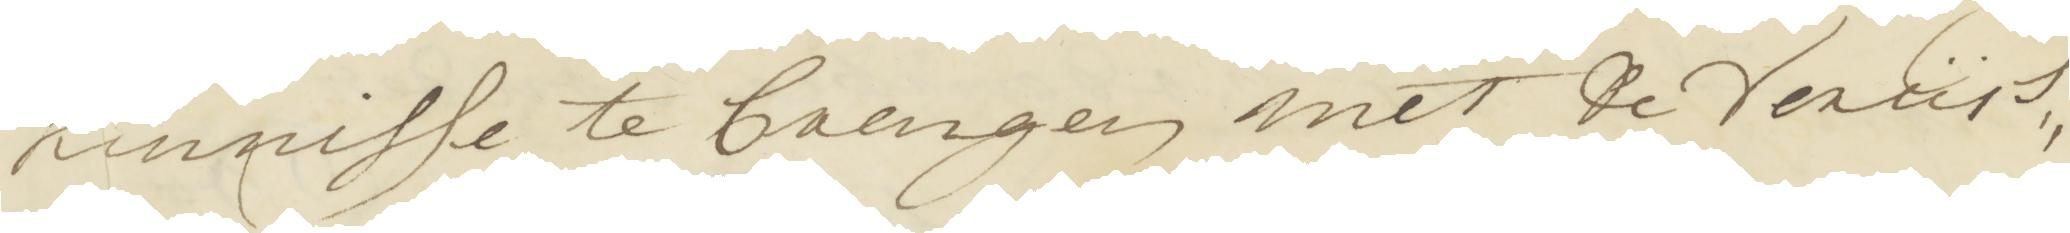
kennisse te brengen met de vereijs„
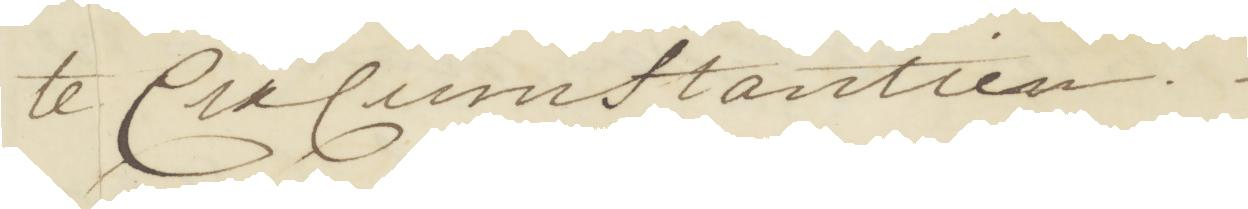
te circumstantien.
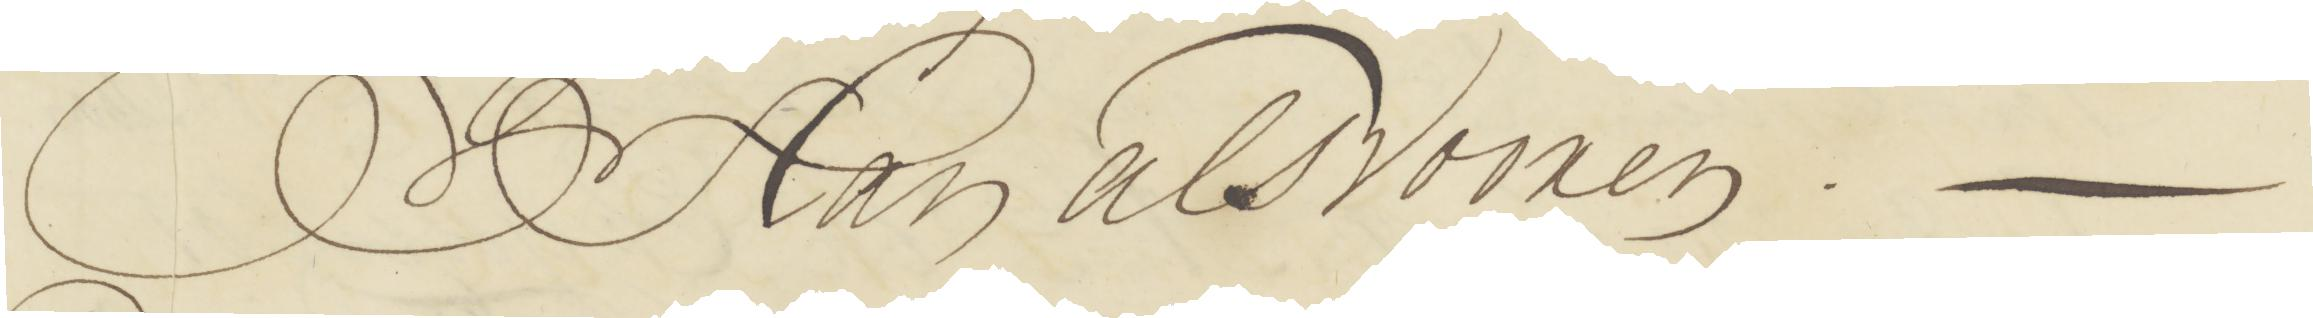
Aan als vooren. —
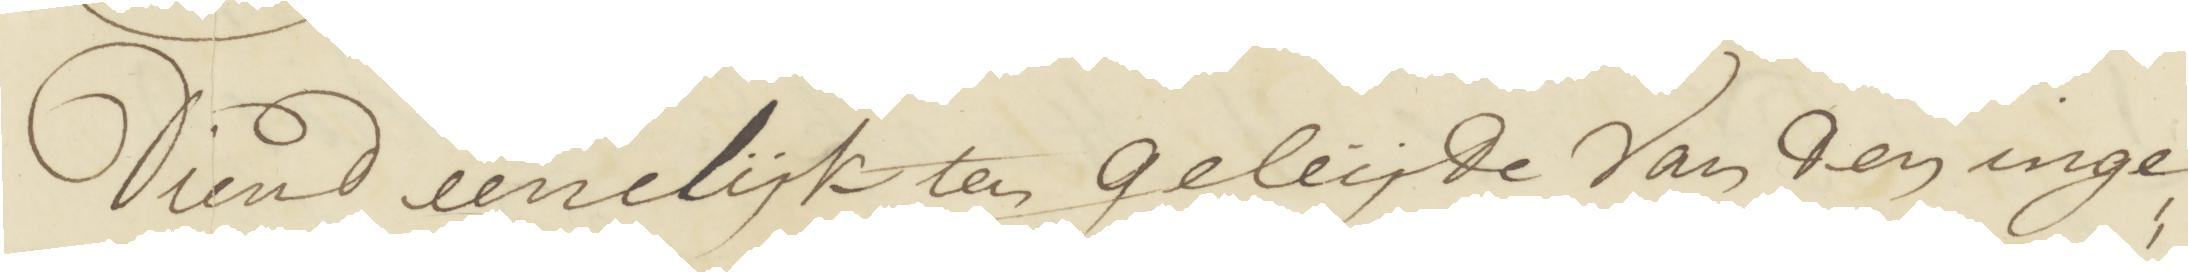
diend eenelijk ten geleijde van den inge„
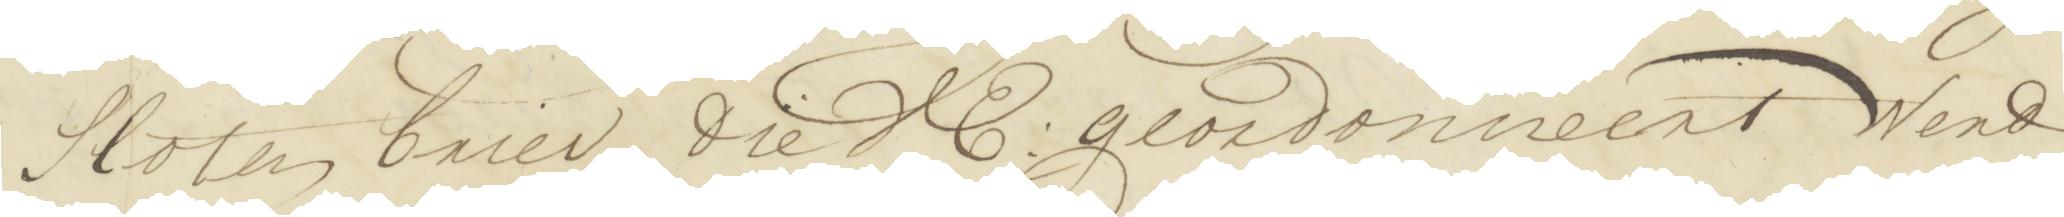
sloten briev, die VE: geordonneert werd
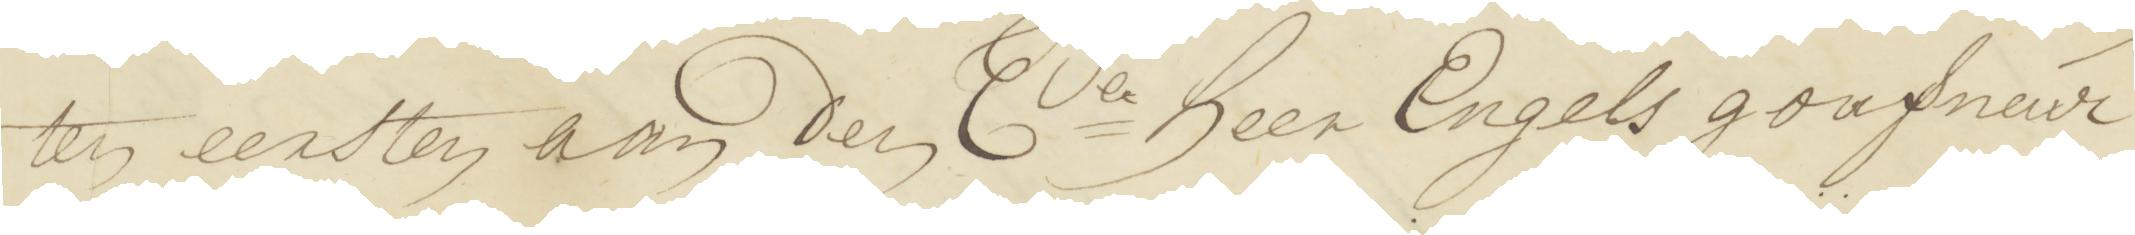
ten eersten aan den E=le Heer Engels gouverneur
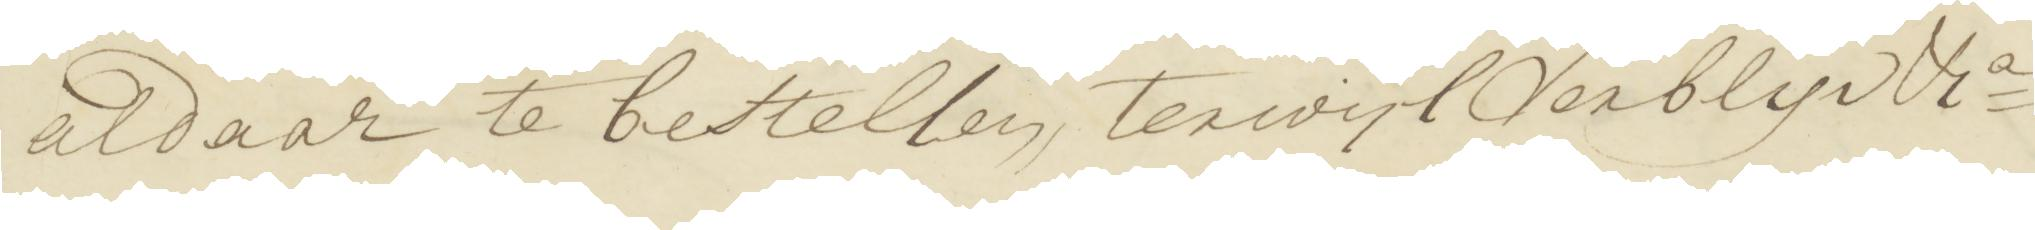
aldaar te bestellen, terwijl verblijv &c=a
